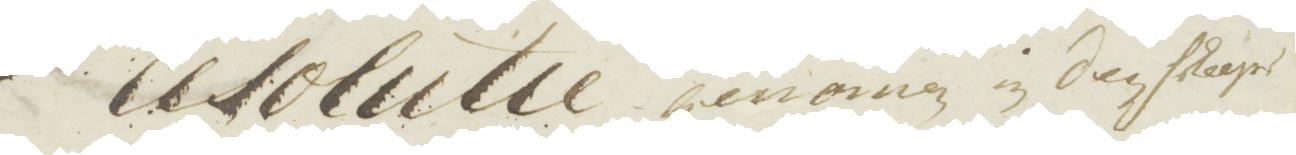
Resolutie genomen in den scheeps
